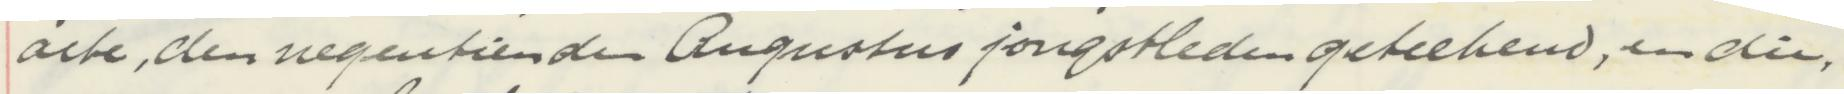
acte, den negentiende Augustus Jongstleden geteekend, en die,
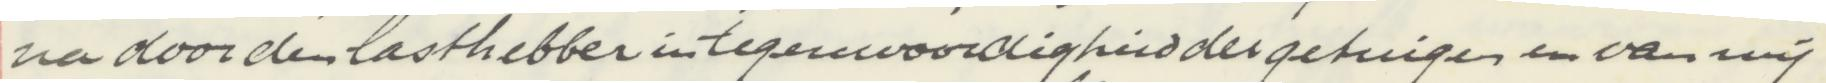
na door den lasthebben in tegenwoordigheid der getuigen en van mij
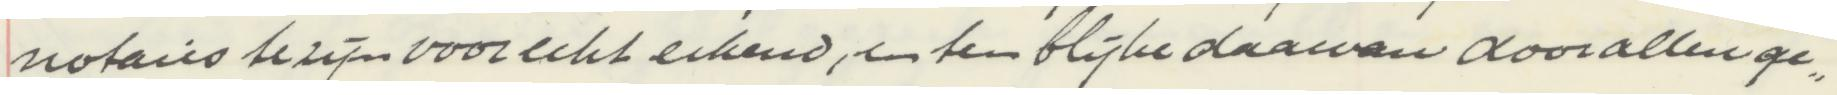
notaris te zijn voor echt erkend, en ten blijke daarvan door allen ge„
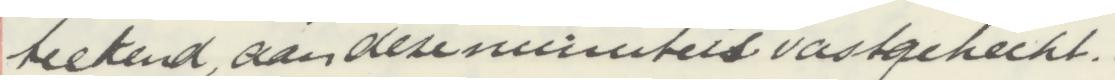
teekend, aan deze minute is vastgehecht.
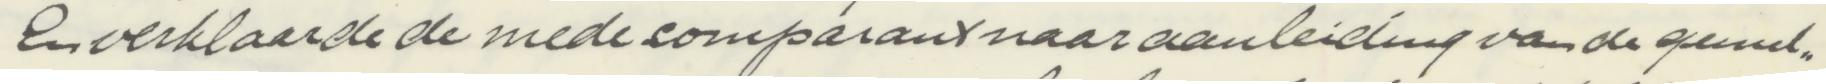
En verklaarde de mede comparant naar aanleiding van de gemel„
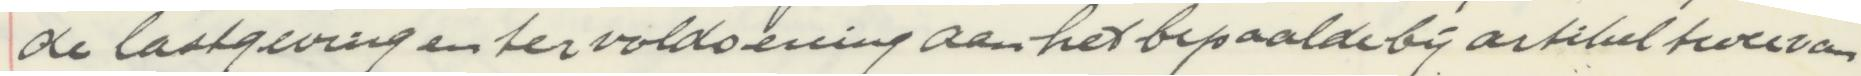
de lastgeving en ter voldoening aan het bepaalde bij artikel twee van
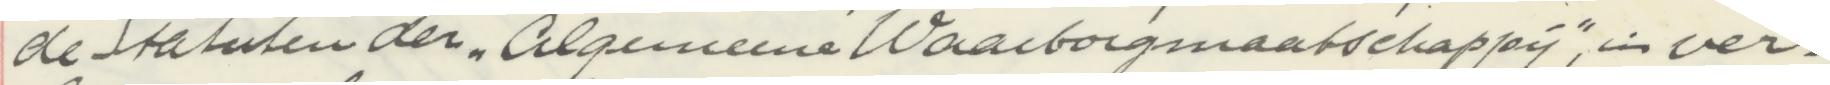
de Statuten der„ Algemeene Waarborgmaatschappij", in ver-
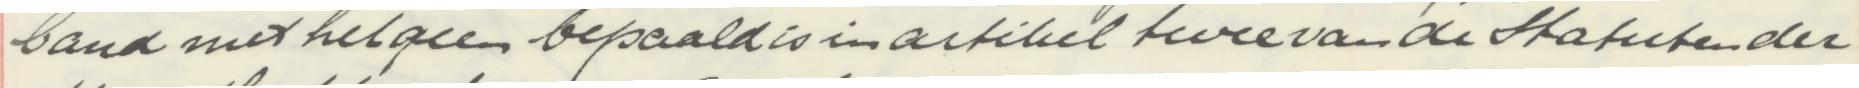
band met het geen bepaald is in artikel twee van de statuten der
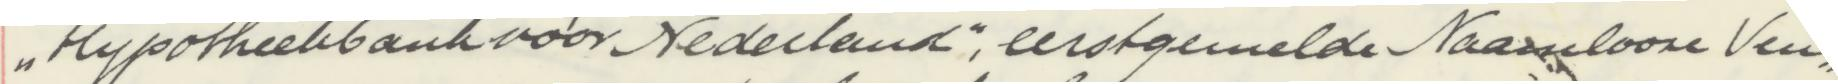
„Hypotheekbank voor Nederland, eerstgemelde Naamlooze Ven„
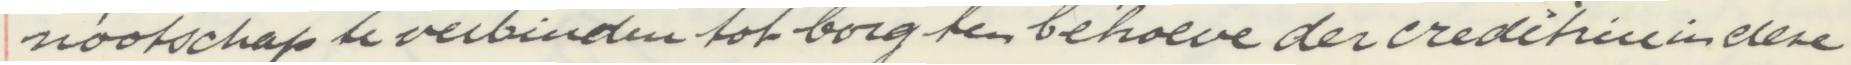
nootschap te verbinden tot borg ten behoeve der crediteur in deze
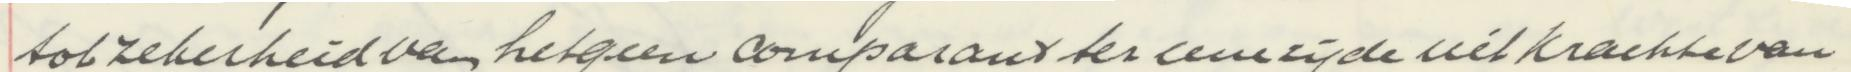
tot zekerheid van het geen comparant ter eene zijde uit krachte van
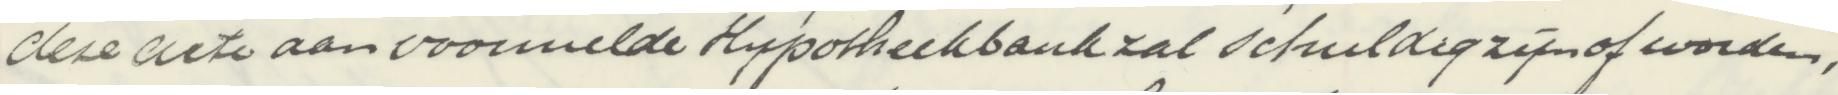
deze acte aan voormelde Hypotheekbank zal schuldig zijn of worden,
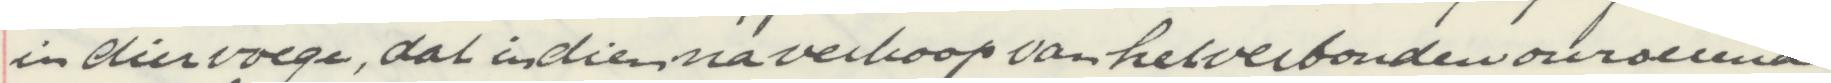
in diervoege, dat indien na verkoop van het verbonden onroerend
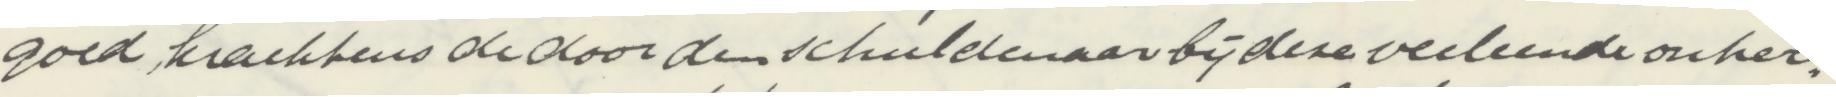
goed, krachtens de door den schuldenaar bij deze verleende onher„
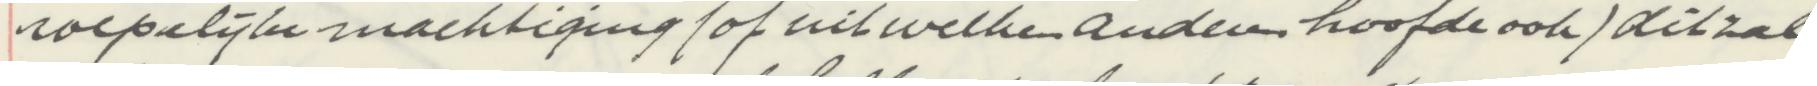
roepelijke machtiging (of uit welken anderen hoofde ook dit zal
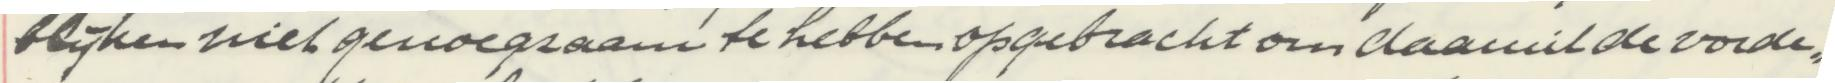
blijken niet genoegzaam te hebben opgebracht om daaruit de vorde„
